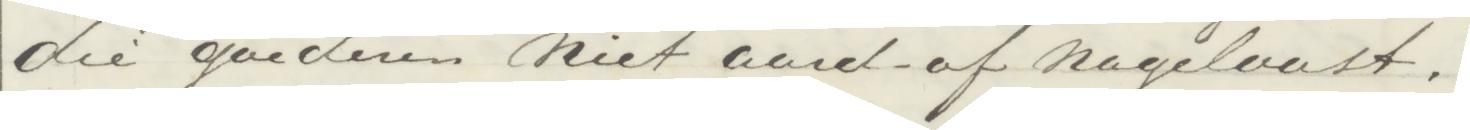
die goederen niet aard- of nagelvast.
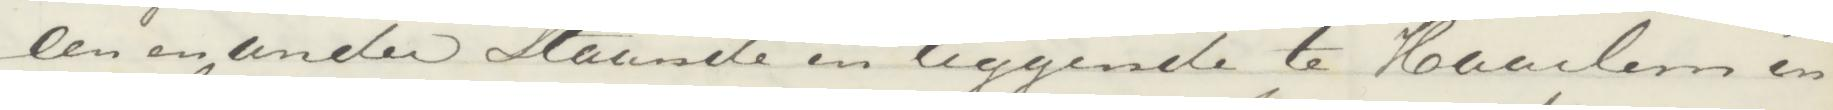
een en ander staande en liggende te Haarlem in
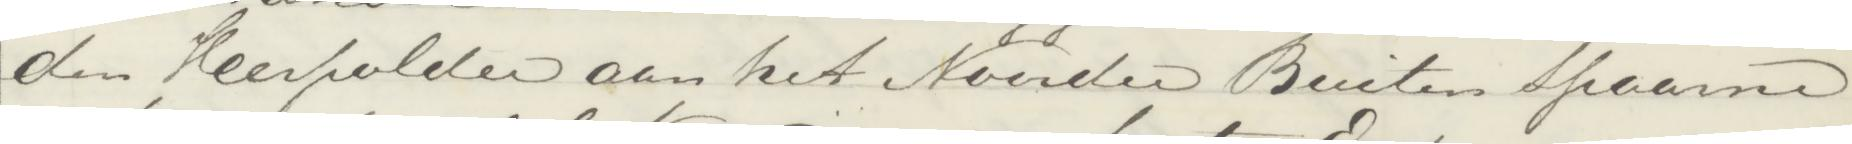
den Veerpolder aan het Noorder Buiten spaarne
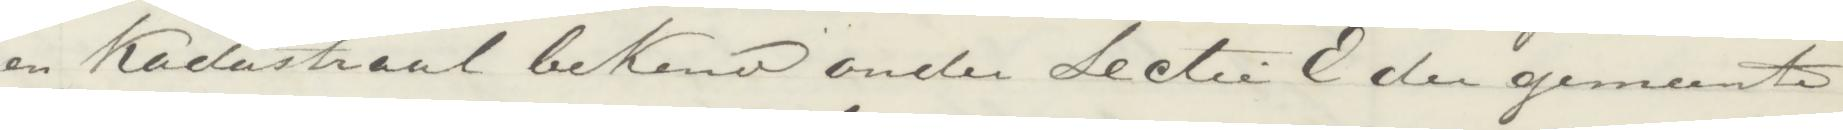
en kadastraal bekend onder sectie E der gemeente
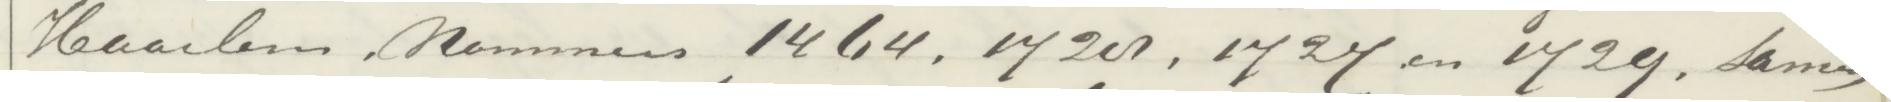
Haarlem, Nommers 1464, 1728, 1727, en 1729, samen
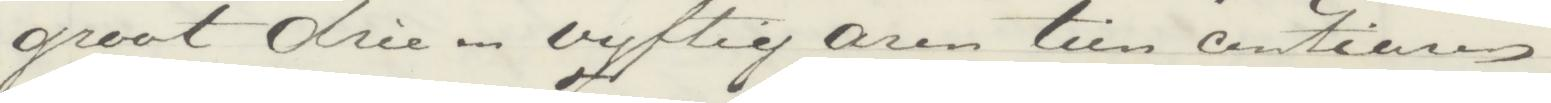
groot drie en vyftig aren tien centieren
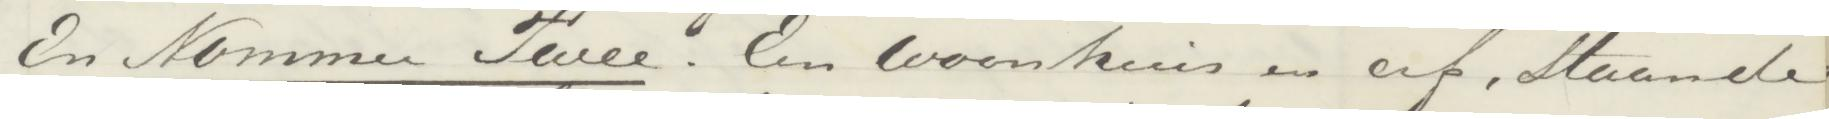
En Nommer Twee. Een woonhuis en erf, staande
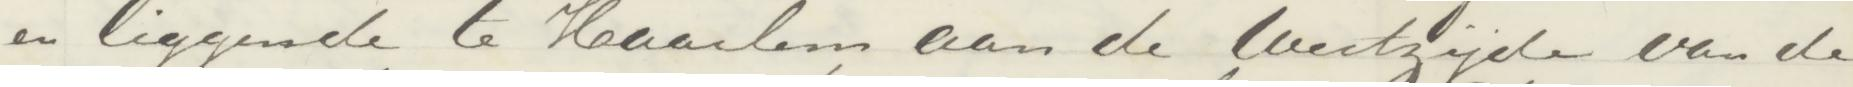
en liggende te Haarlem aan de Westzijde van de
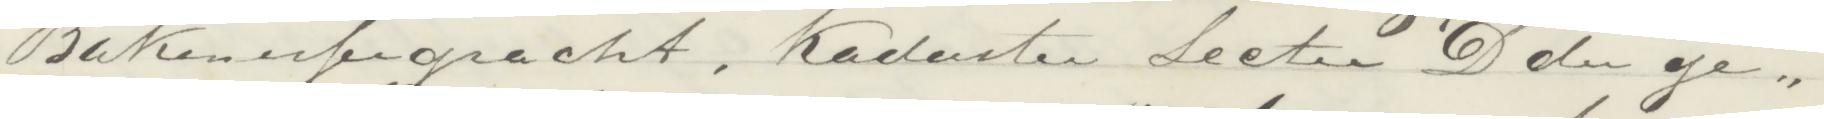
Bakenessergracht, Kadaster sectie D der ge„
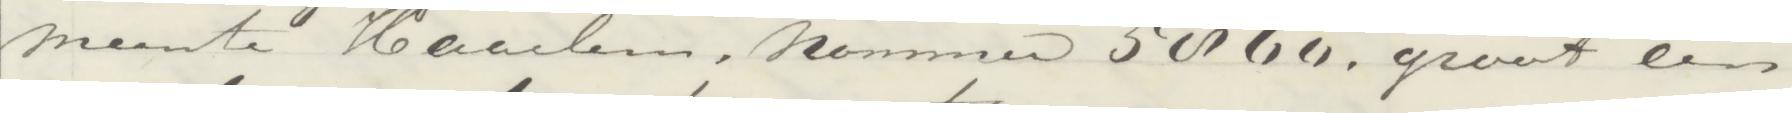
meente Haarlem, Nommer 5860, groot een
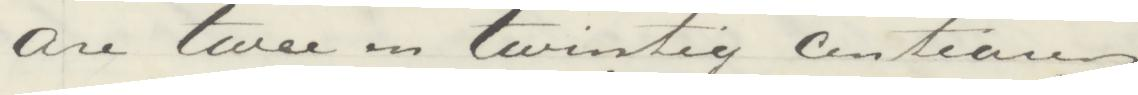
are twee en twintig centearen
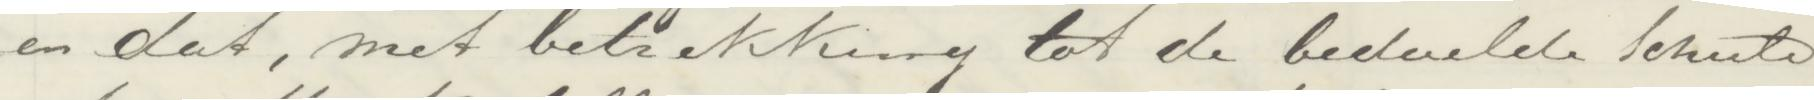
en dat, met betrekking tot de bedoelde schuld
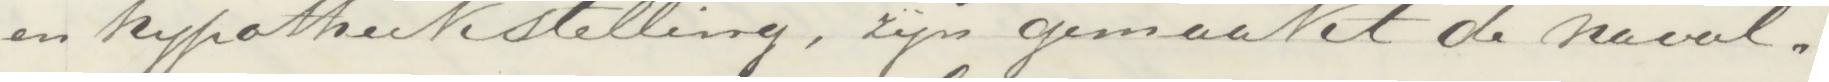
en hypotheekstelling, zijn gemaakt de navol„
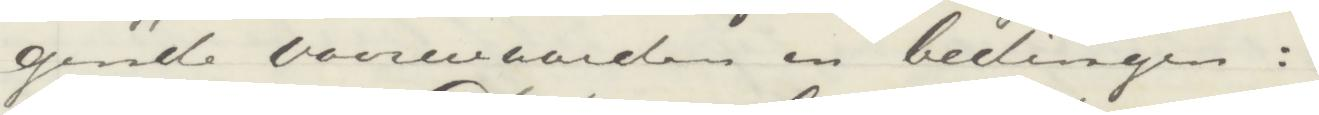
gende voorwaarden en bedingen:
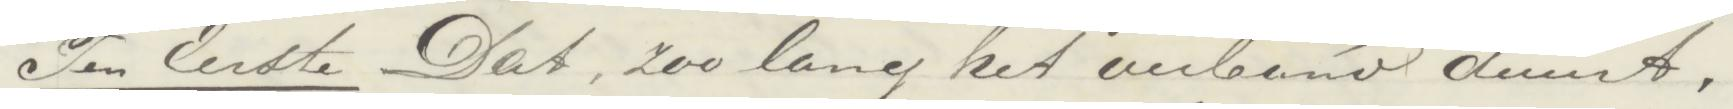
Ten Eerste Dat, zoo lang het verband duurt,
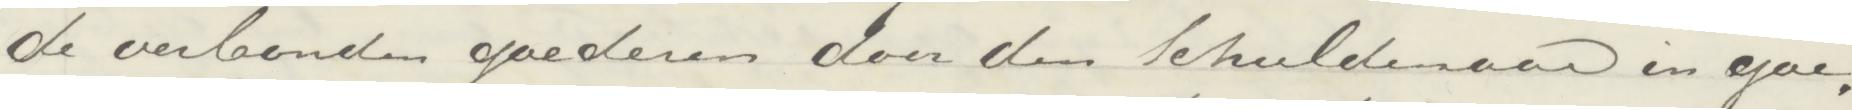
de verbonden goederen door den schuldenaar in goe„
